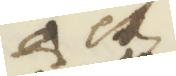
P:et
